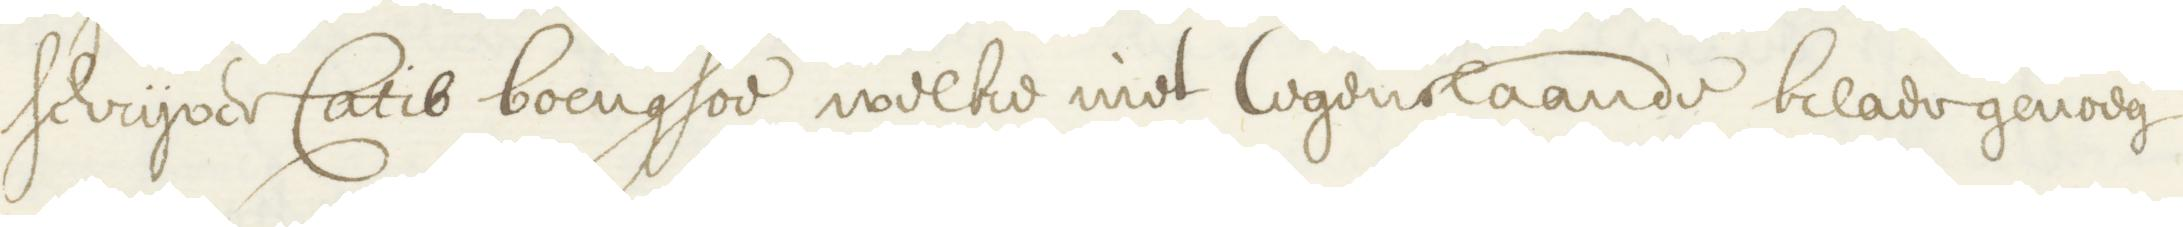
schrijver Catib boengsoe welke niet tegenstaande klaer genoeg
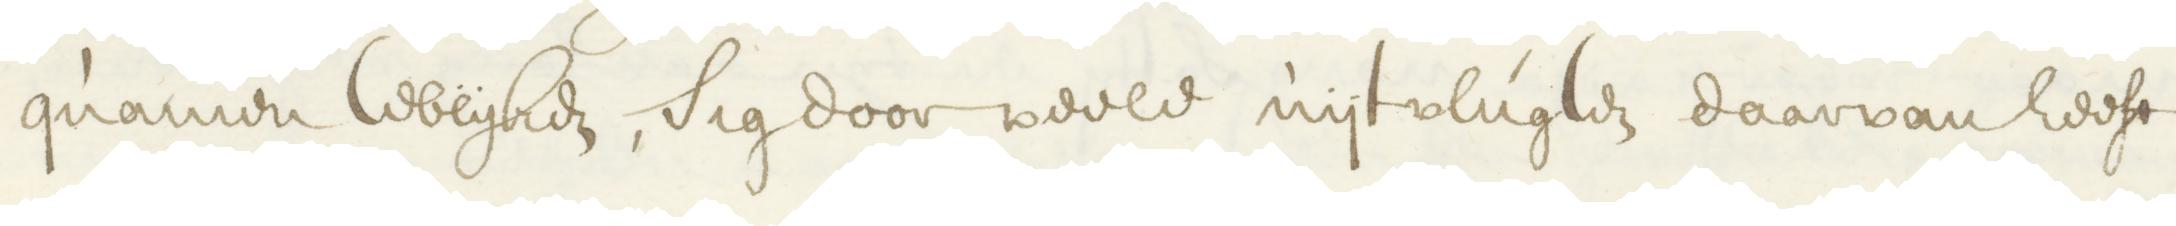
quamen teblijken, sig door veele uijtvlugten daarvan heeft
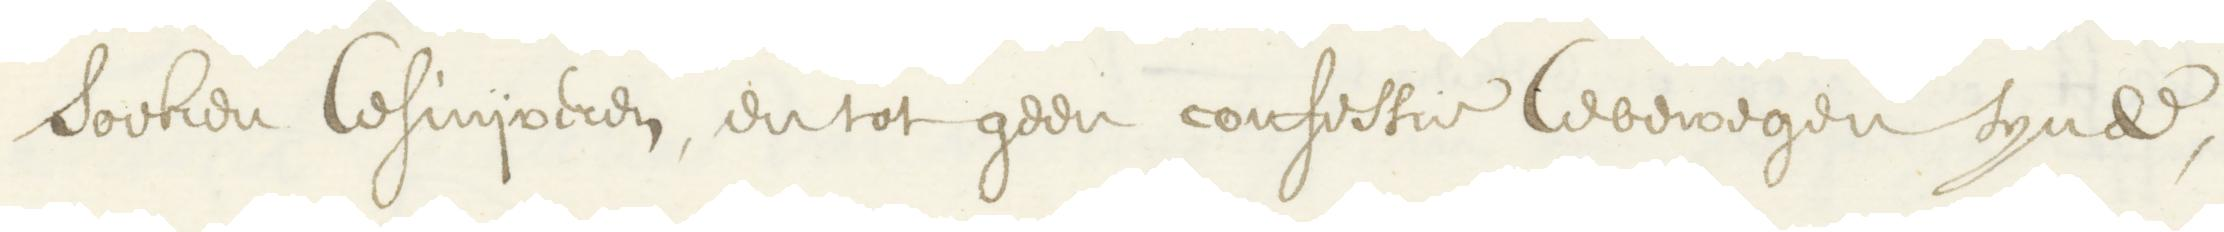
soeken tesuijveren, en tot geen confessie tebewegen synde,
